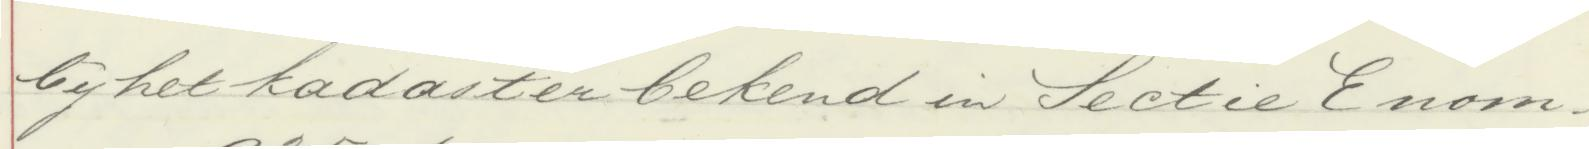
bij het kadaster bekend in sectie E nom
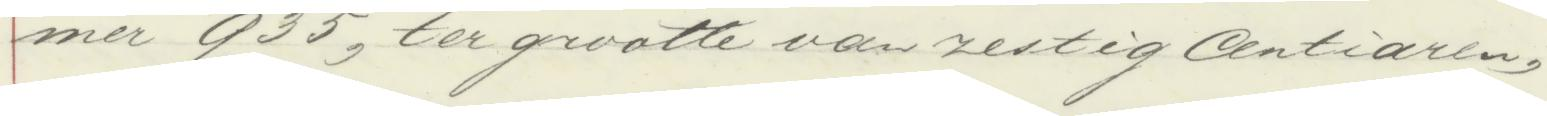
mer 935, ter grootte van zestig Centiaren,
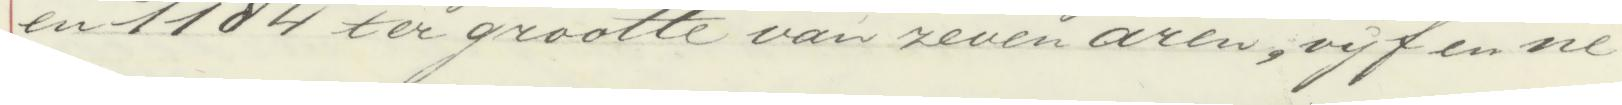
en 1181 ter grootte van zeven aren, vijf en ne
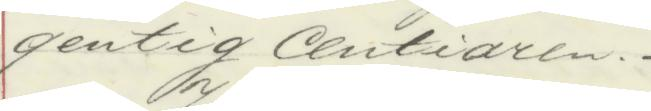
gentig Centiaren.
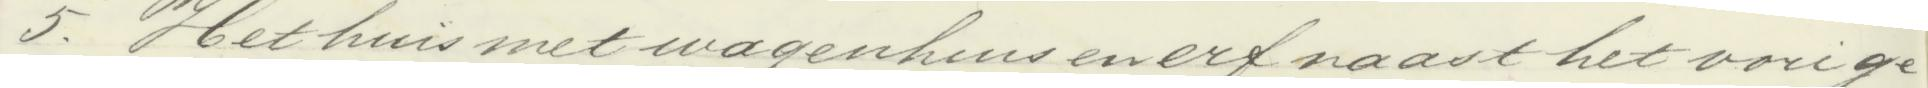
5. Het huis met wagenhuis en erf naast het vorige
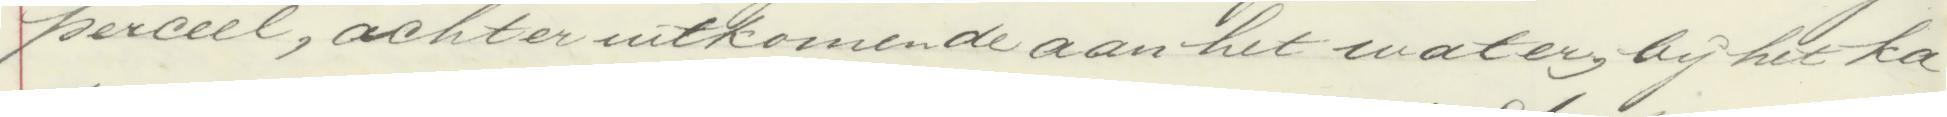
perceel, achter uitkomende aan het water bij het ka
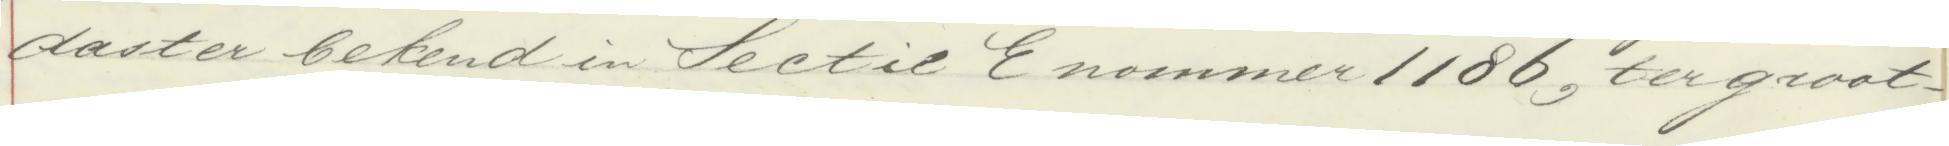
daster bekend in Sectie E nommer 1186, ter groot-
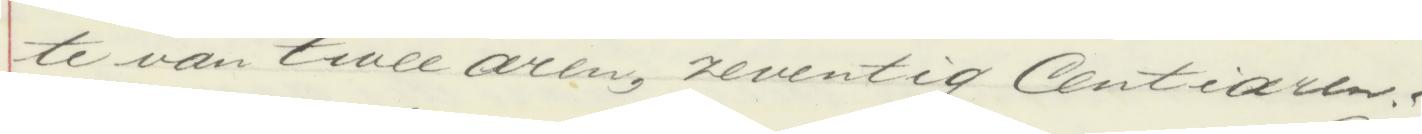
te van twee aren, zeventig Centiaren.
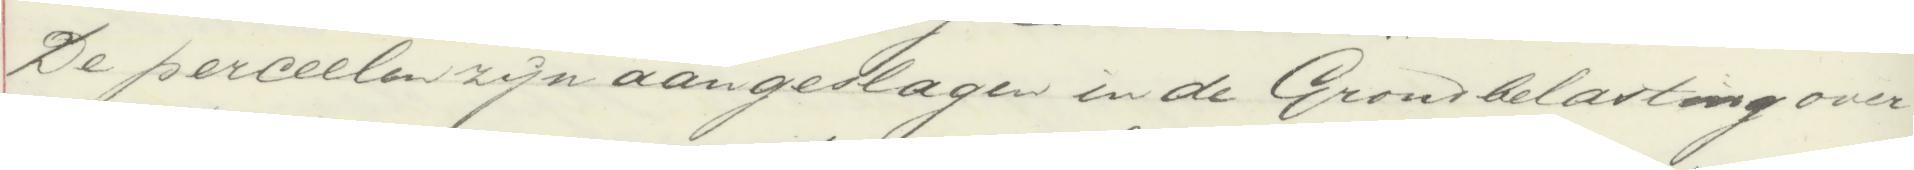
De perceelen zijn aangeslagen in de Grond belasting over
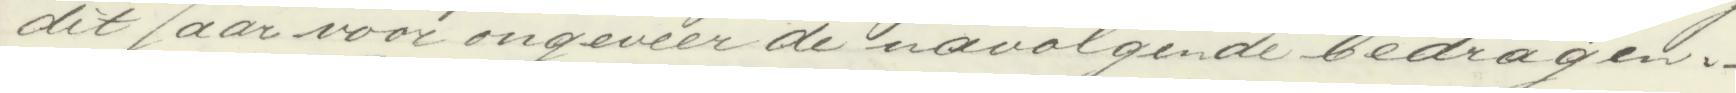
dit jaar voor ongeveer de navolgende bedragen.
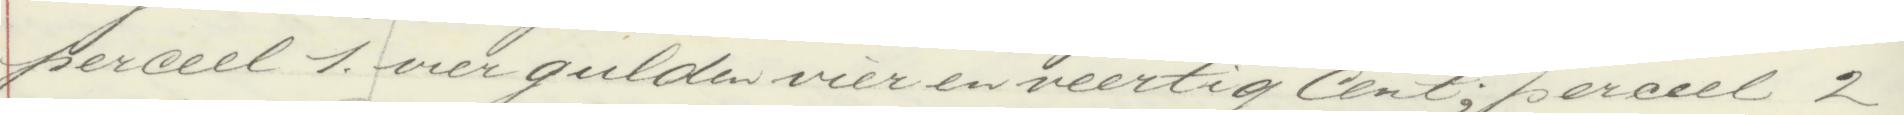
perceel 1. vier gulden vier en veertig Cent; perceel 2
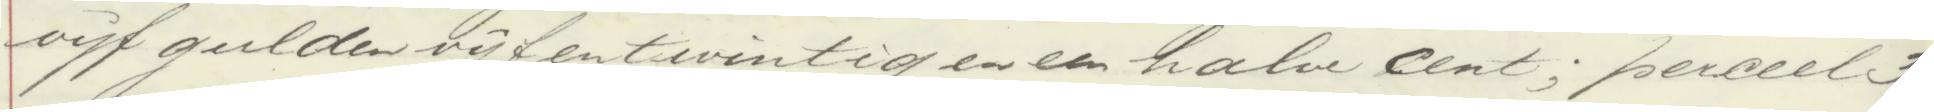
vijf gulden vijf en twintig en een halve cent; perceel 3
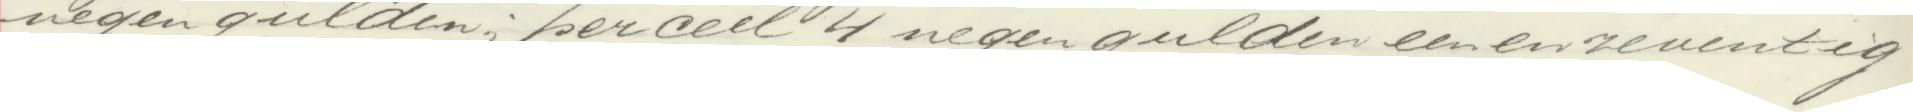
negen gulden; perceel 4 negen gulden een en zeventig
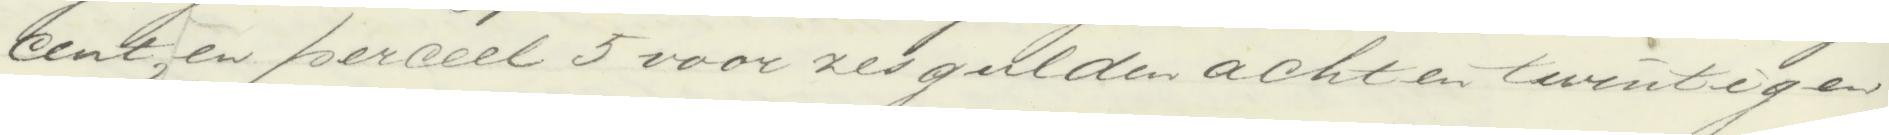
cent, en perceel 5 voor zes gulden acht en twintig en
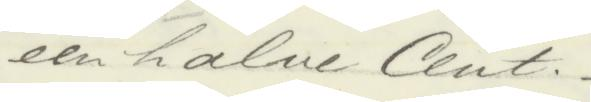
een halve Cent.
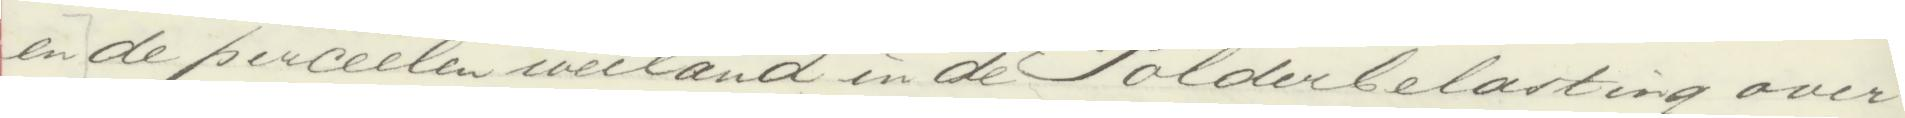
en de perceelen weiland in de Polderbelasting over
